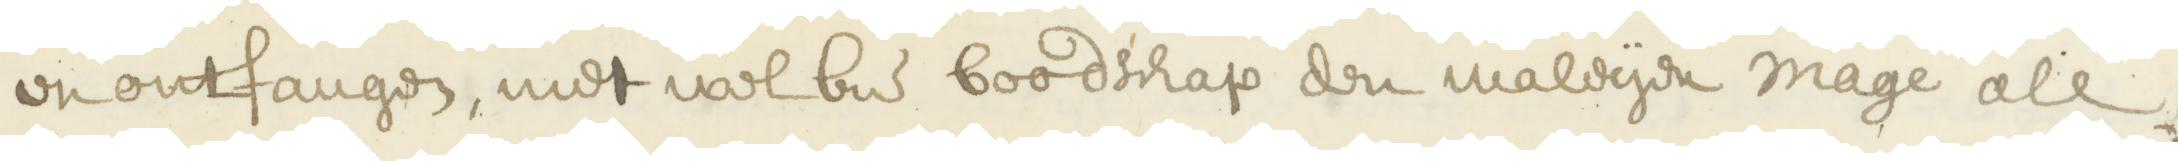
en ontfangen, met welke boodschap den maleijer mage ale
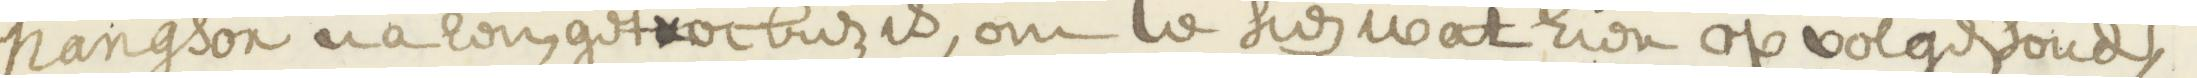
pangsor na hen getrocken is, om te sien wat hier op volgen soude,
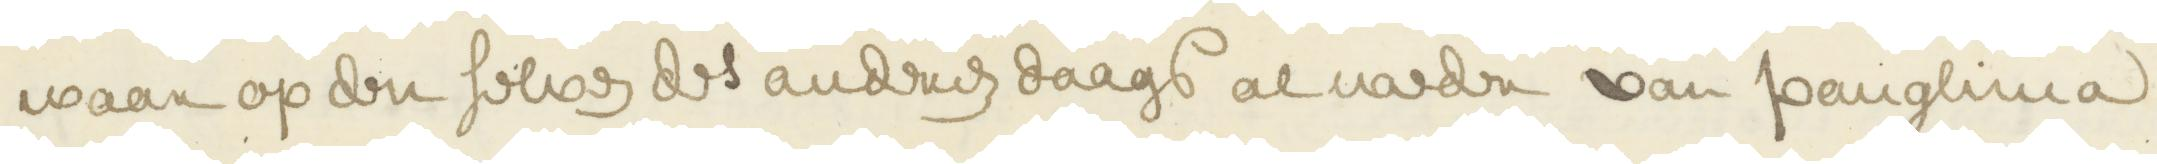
waar op den selven des anderen daags al weder van panglima
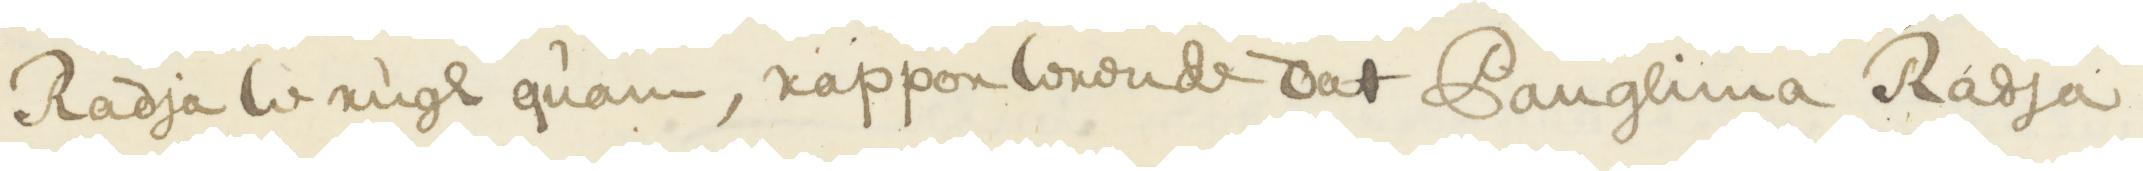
Radja te rugh quam, rapporterende dat Panglima Radja
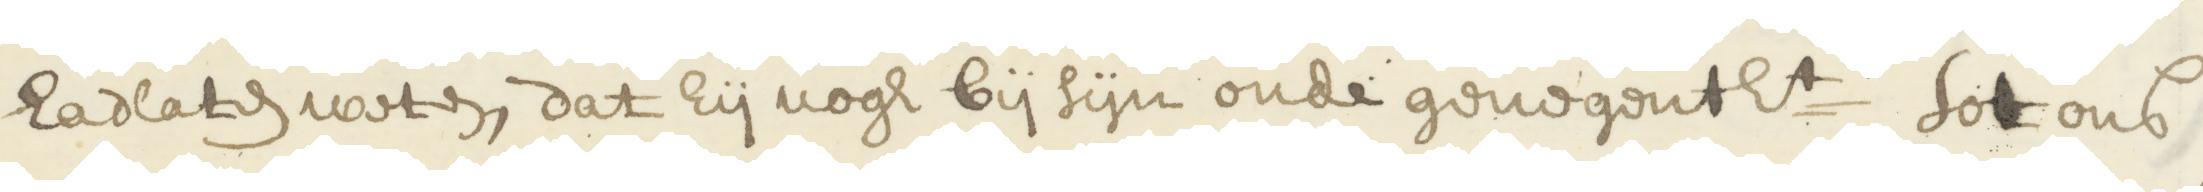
had laten weten, dat hij nogh bij sijn oude genegenth=t tot ons
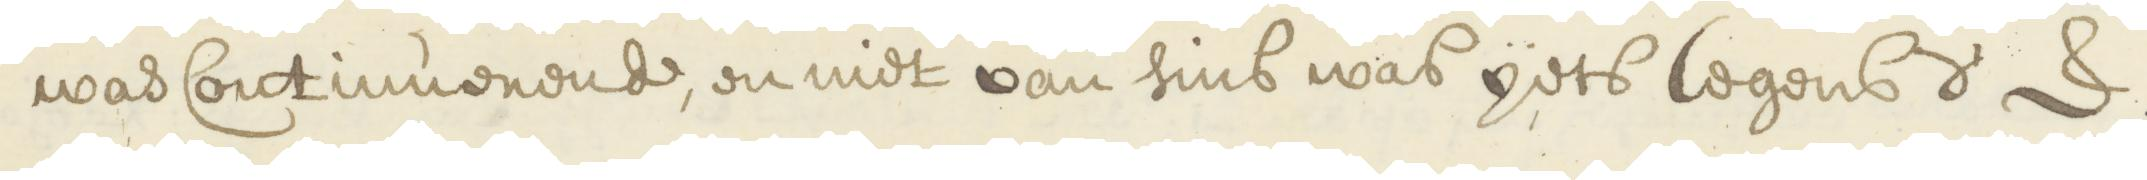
was continuerende, en niet van sins was ijets tegens d' E
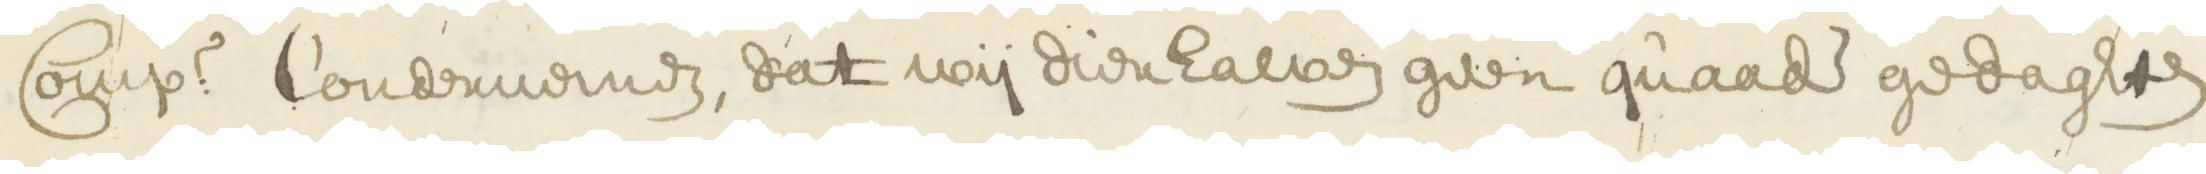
Comp:' t'ondernemen, dat wij dier halven geen quaade gedaghten
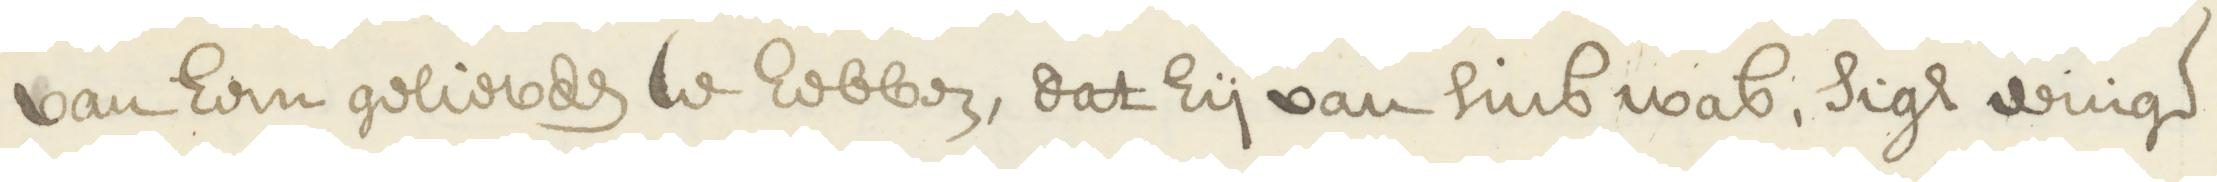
van hem gelievden te hebben, dat hij van sins was, sigh eenige
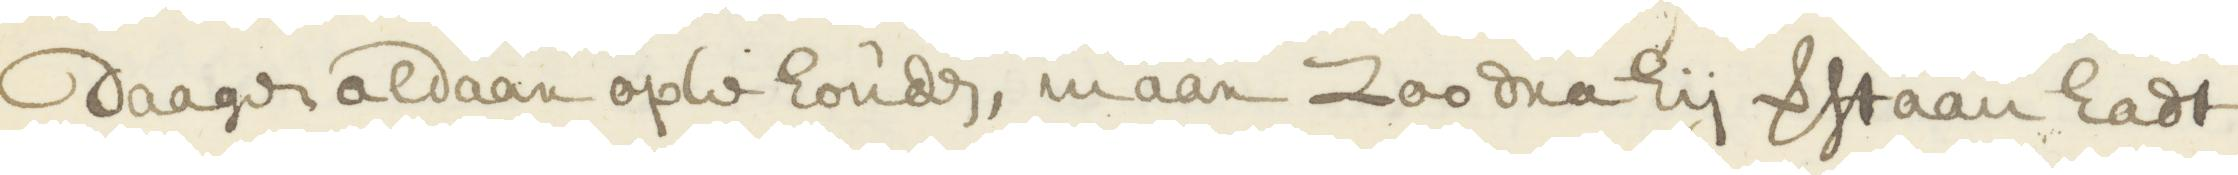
daagen aldaar op te houden, maar zoo dra hij verstaan, hadt
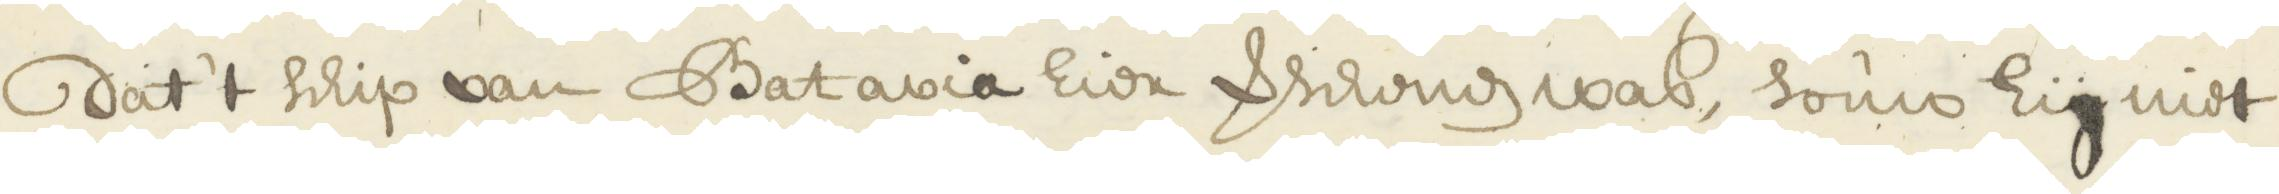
dat ’t schip van Batavia hier verschenen was, souw hij niet
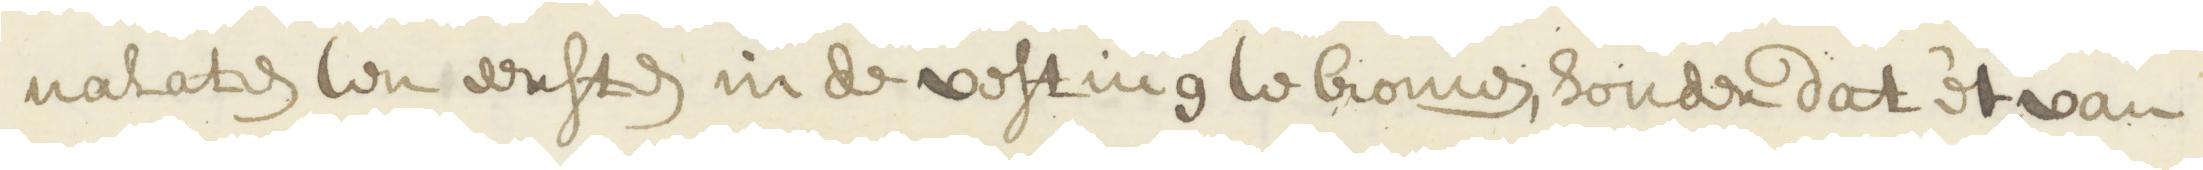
nalaten ten eersten in de vesting te komen, sonder dat 'et van
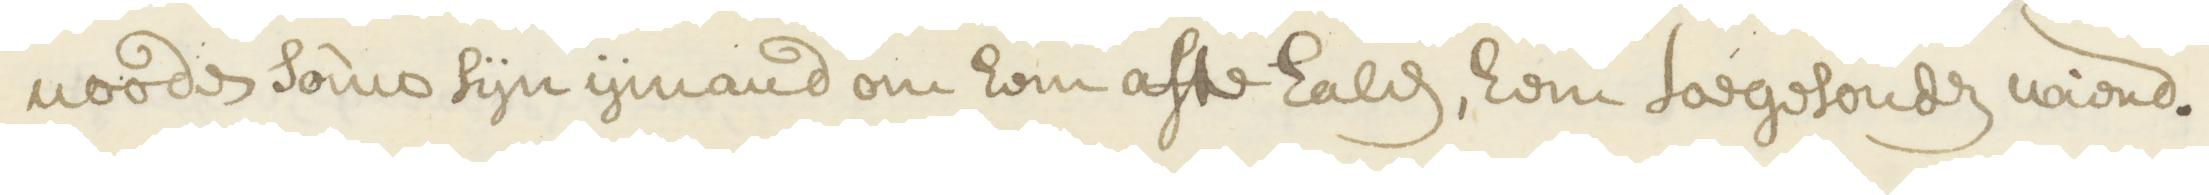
nooden souw sijn ijmand om hem afte halen, hem toegesonden wierd.
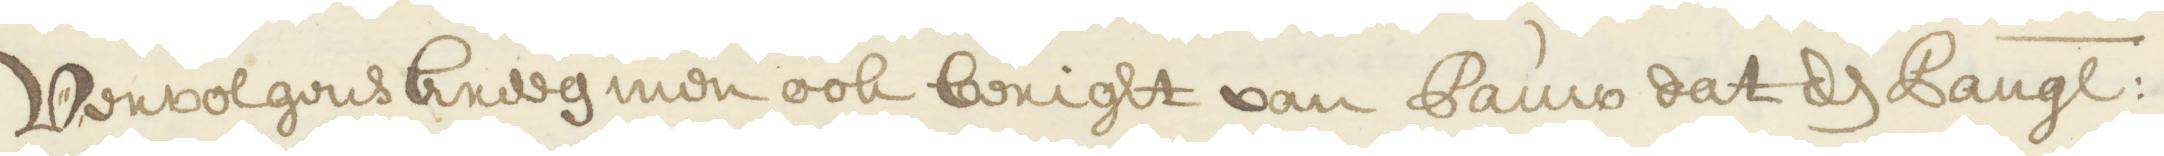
Vervolgens kreeg men ook beright van Pauw dat den Pangl:
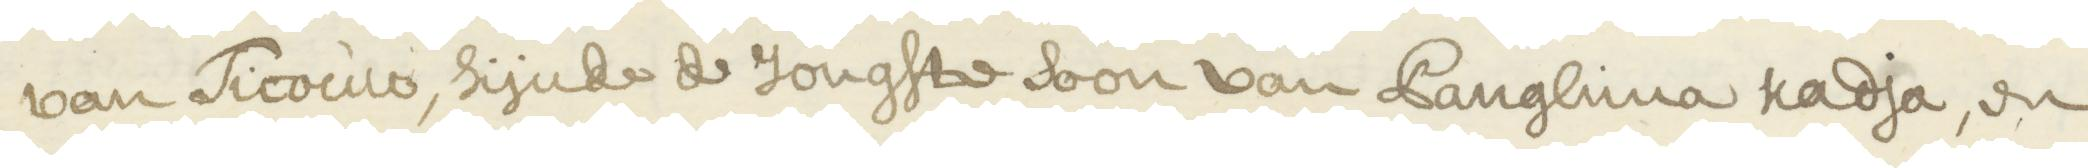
van Ticouw, sijnde de Jongste soon van Panglima radja, en
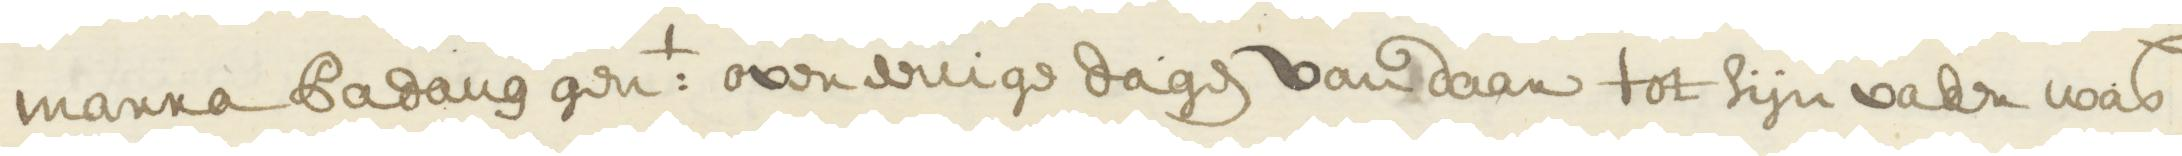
marra Padang gen:t over eenige dagen van daar tot sijn vader was
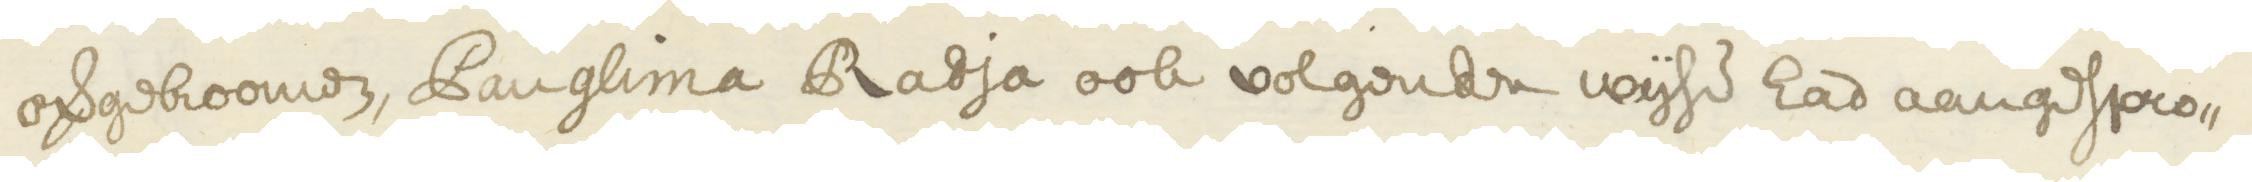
overgekoomen, Panglima Radja ook volgender wijse had aangespro„
